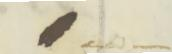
1.-
